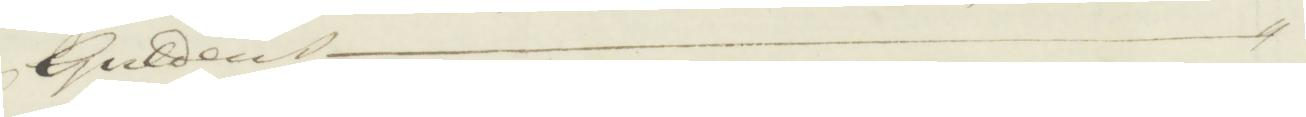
Guldens—„
